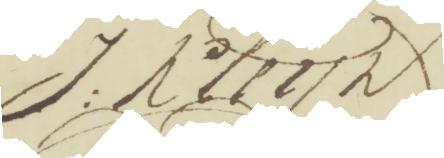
J:Kleyn
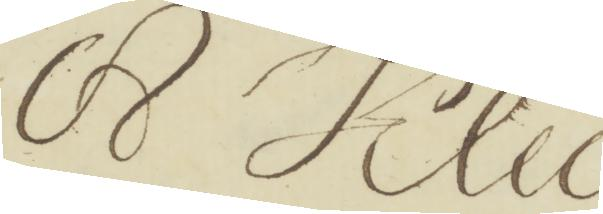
A Klee
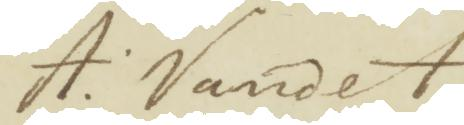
A: Van det
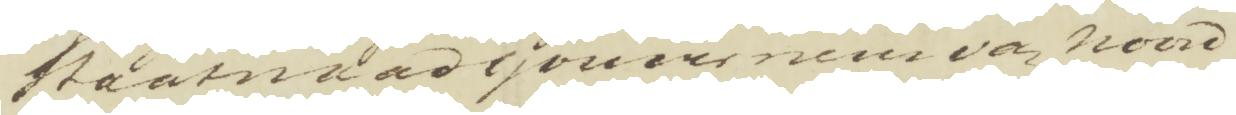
staatsraad Gouverneur van noord
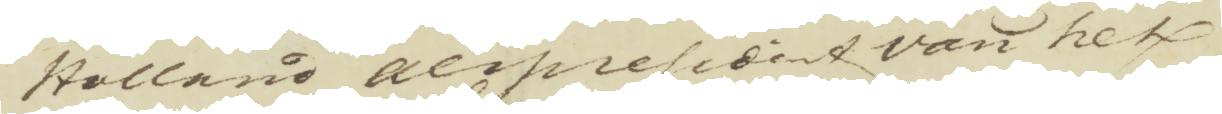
Holland als president van het
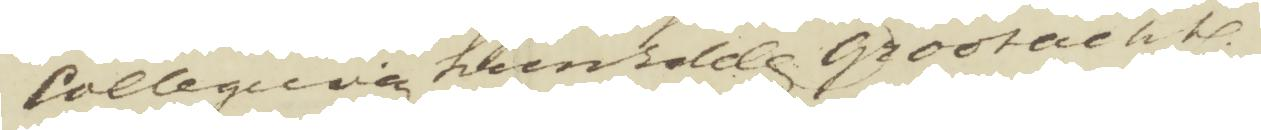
Collegie van hun Edelen Groot acht.
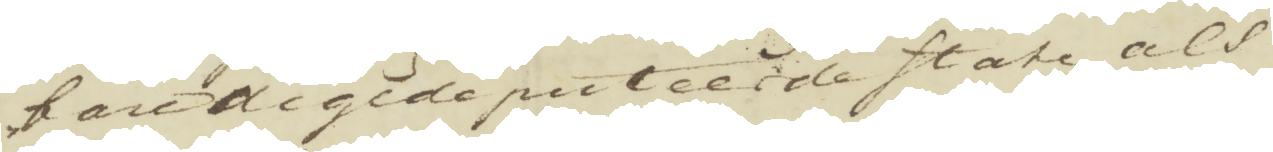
„bare de gedeputeerde staten als
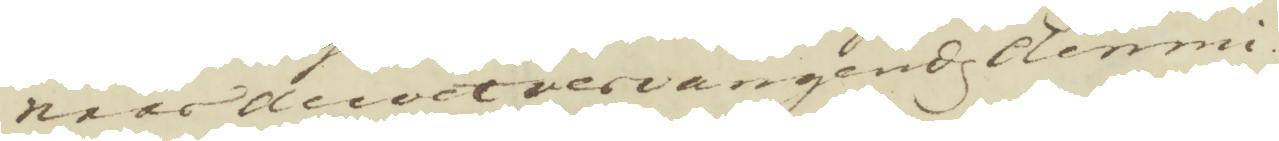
naar de wet vervangende de mi
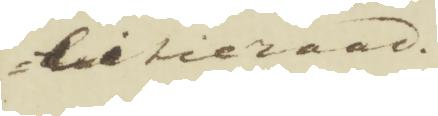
=litieraad.
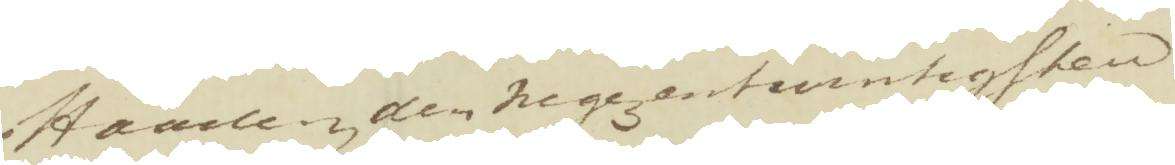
Haarlem den negen entwintigsten
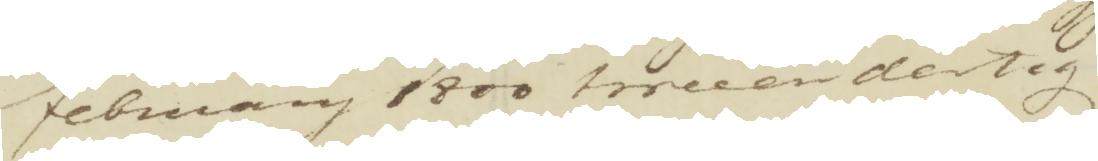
february 1800 twee en dertig
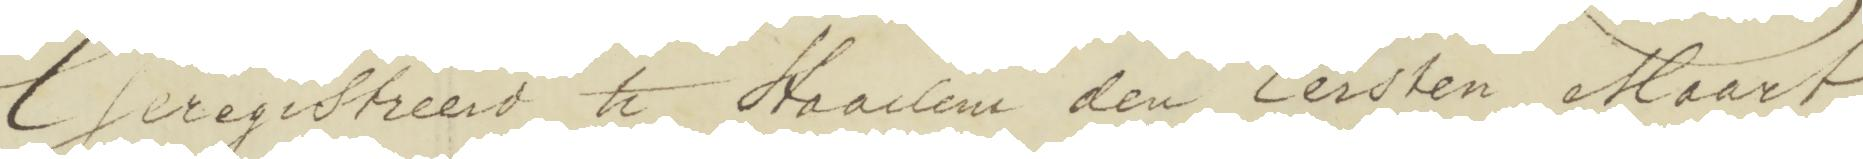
Geregistreerd te Haarlem den Eersten Maart
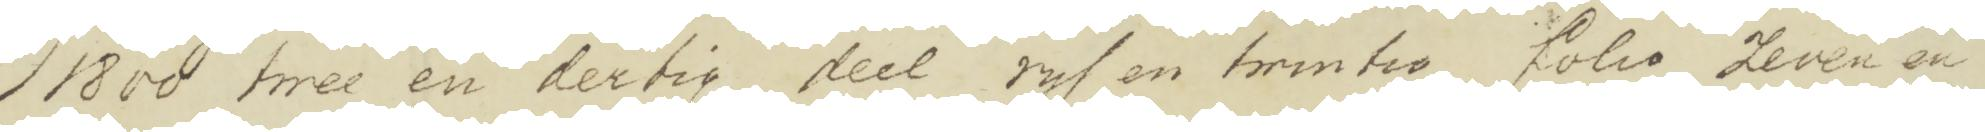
1800 twee en dertig deel vyf en twintig folio zeven en
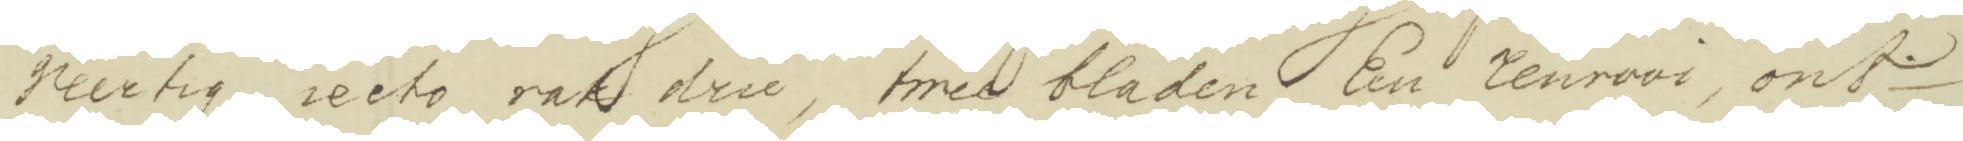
veertig recto vak drie, twee bladen Een renrooi, ont
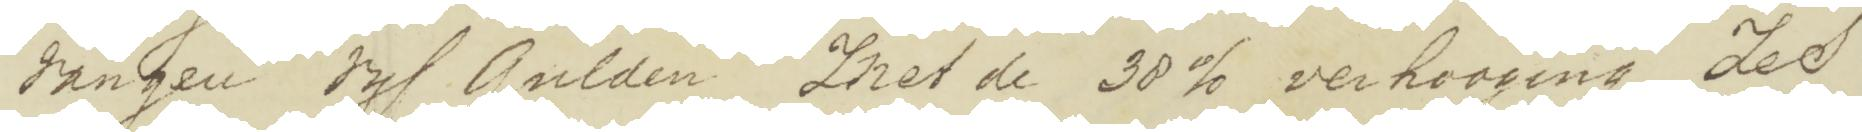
vangen vyf Gulden znet de 38% verhooging zes
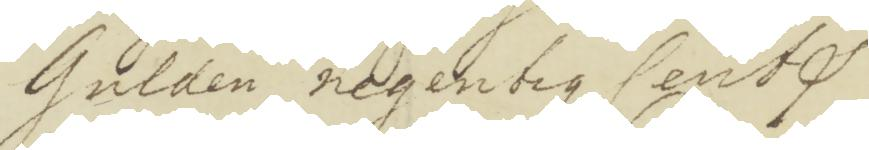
Gulden negentig Cents
